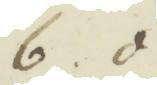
6. d
